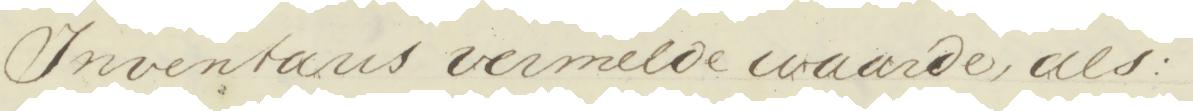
Inventaris vermelde waarde, als:
